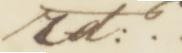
rd:s.
